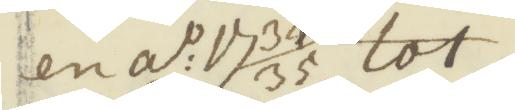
en a:o 17 34/35en tot
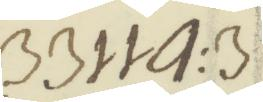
33114:3 8
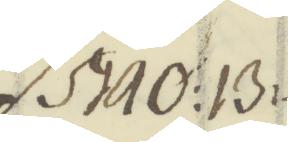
ƒ5140:13:–:
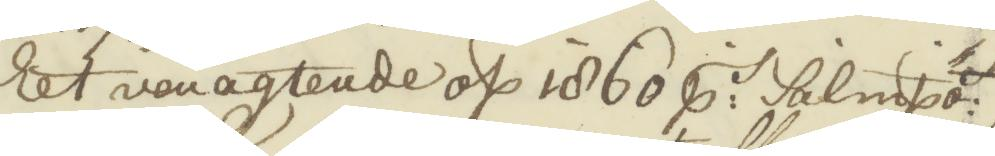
het veragtende op 1860 p:s salmpo:s
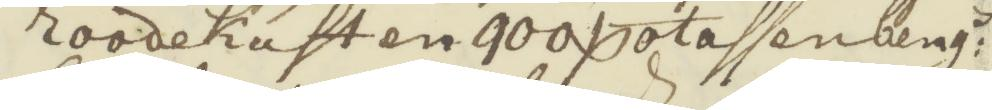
roodekust en 400 potassen beng:s
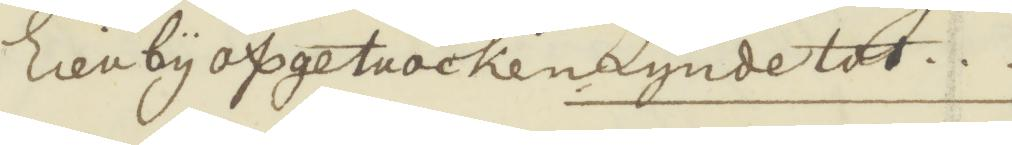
hier bij opgetrocken zynde tot . .
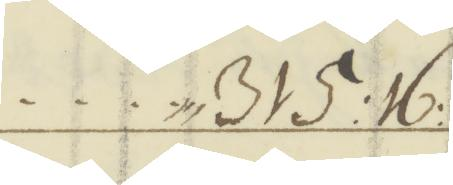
- - . . „ 315:16:8:
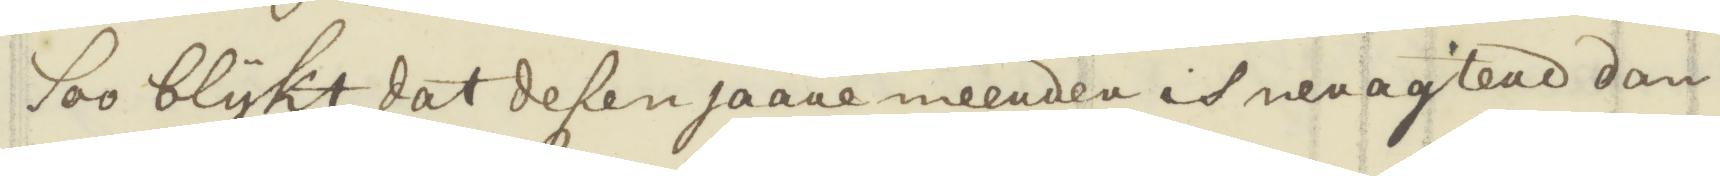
Soo blijkt dat desen jaare meerder is verag'terd dan
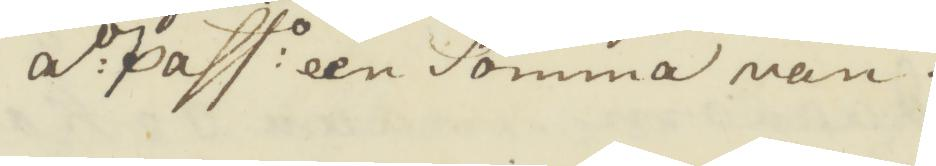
a:o pass:o een somma van
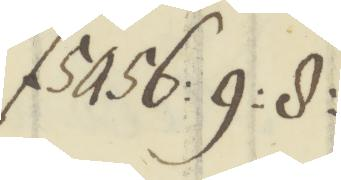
ƒ5456:9:8:
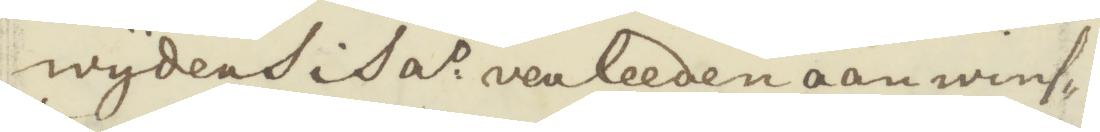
wijders is a:o verleeden aan wins„
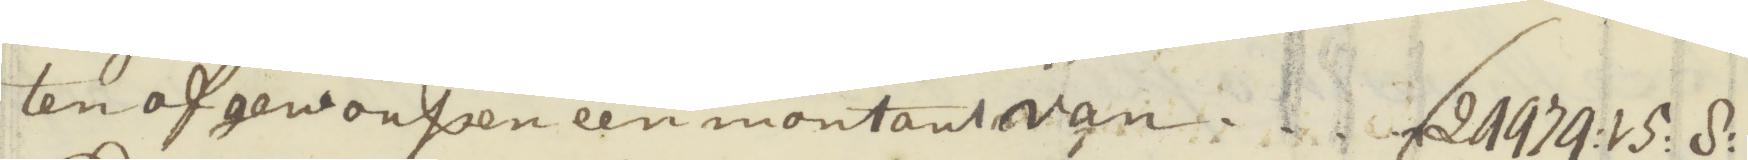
ten afgeworpen een montant van . . . .ƒ24474:15:8:
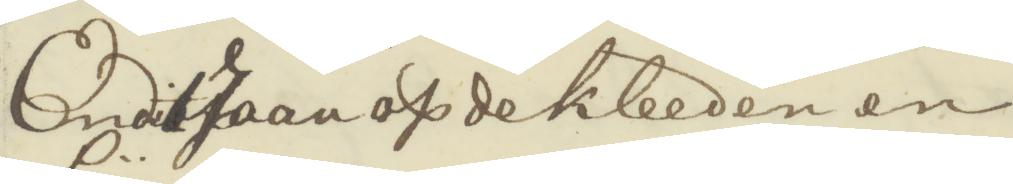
En dit Jaar op de kleeden en
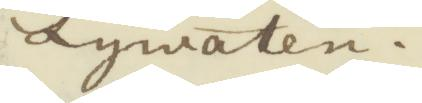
Lijwaten .
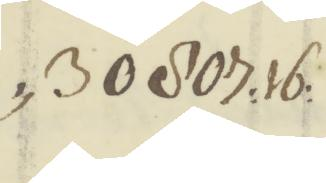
„30807:16:8.
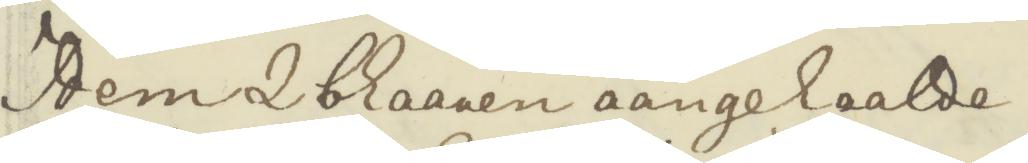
Jdem 2 bhaaren aangehaalde
